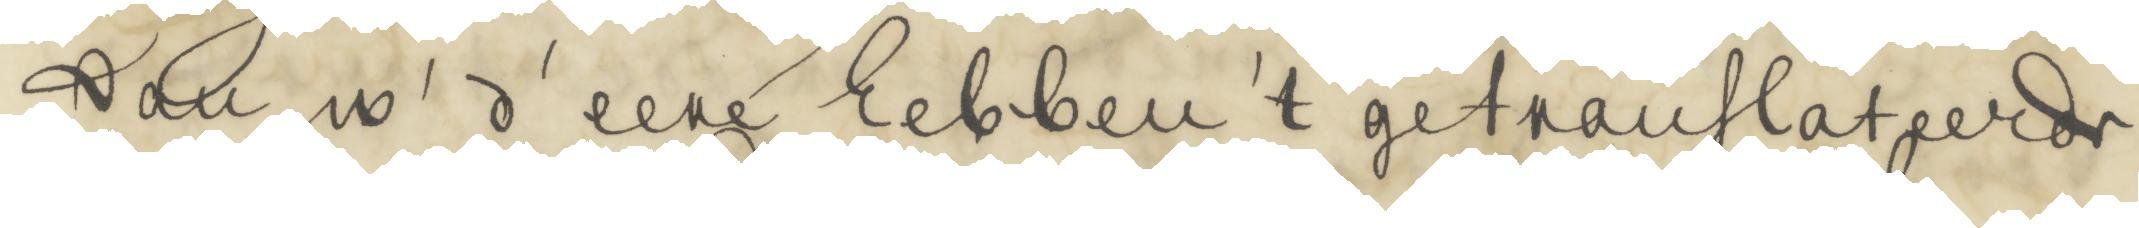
van w' d’eere hebben ’t getranslateerde
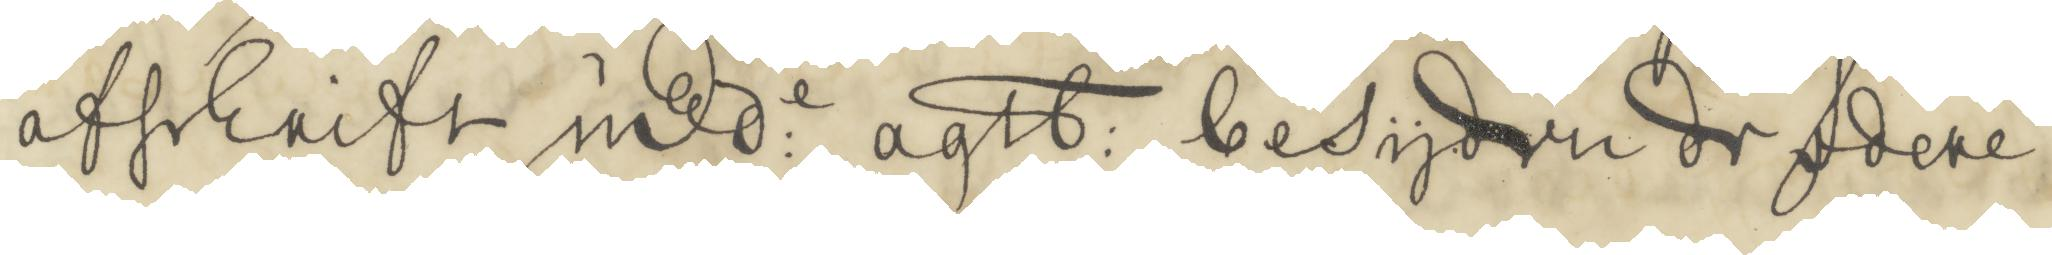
afschrift u Ed:e agtb: besijden de verdere
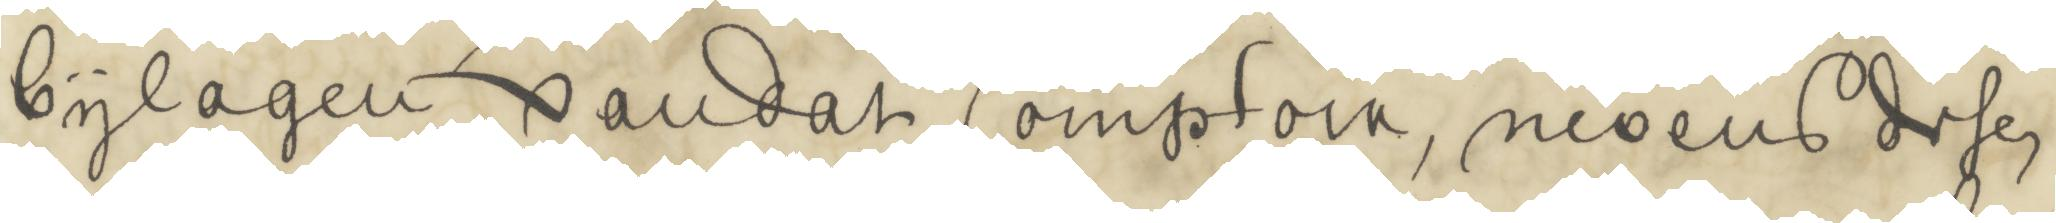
bijlagen vandat Comptoir, nevens desen
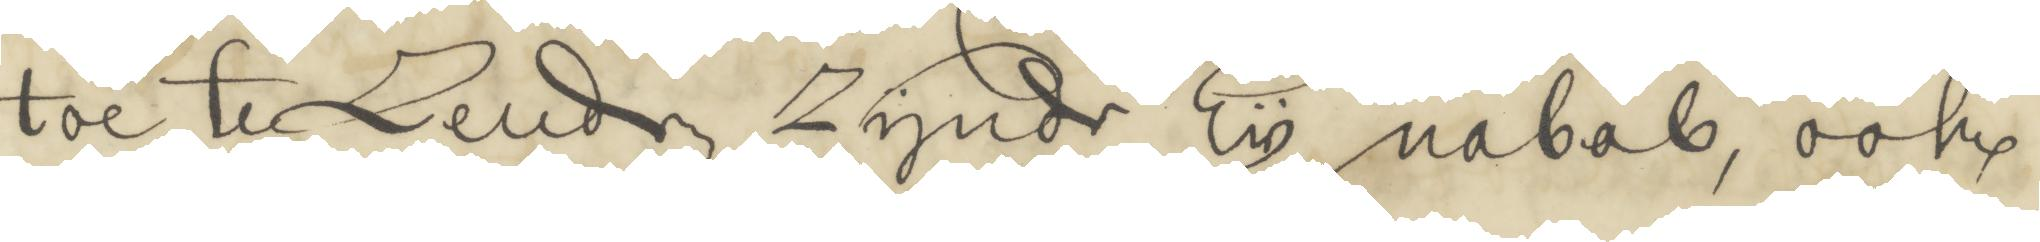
toe te zenden zijnde hij nabab, ook
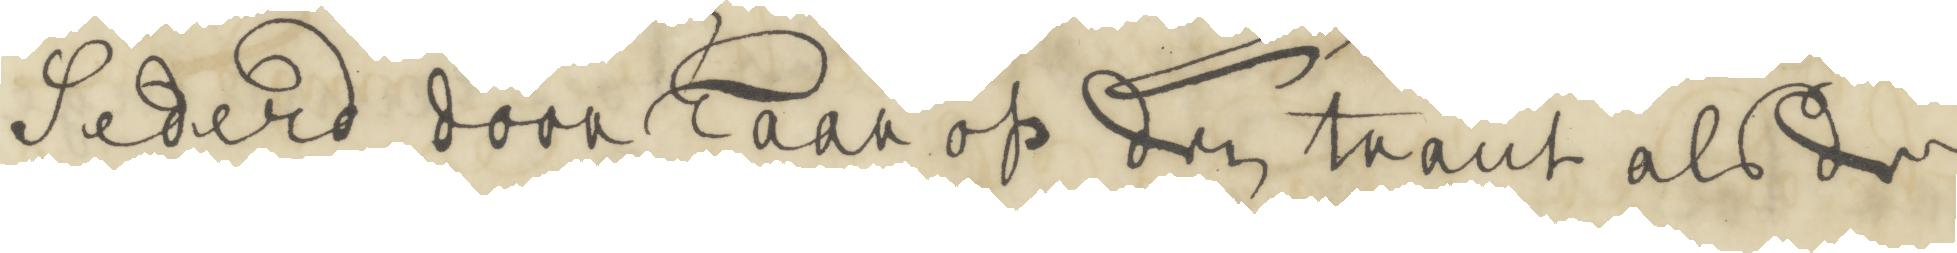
sederd door haar op den trant als de
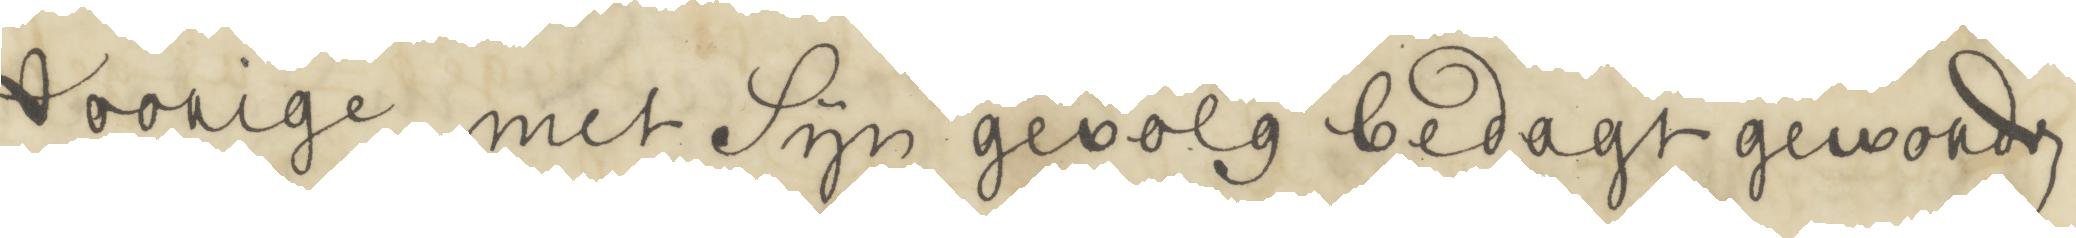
voorige, met sijn gevolg bedagt geworden
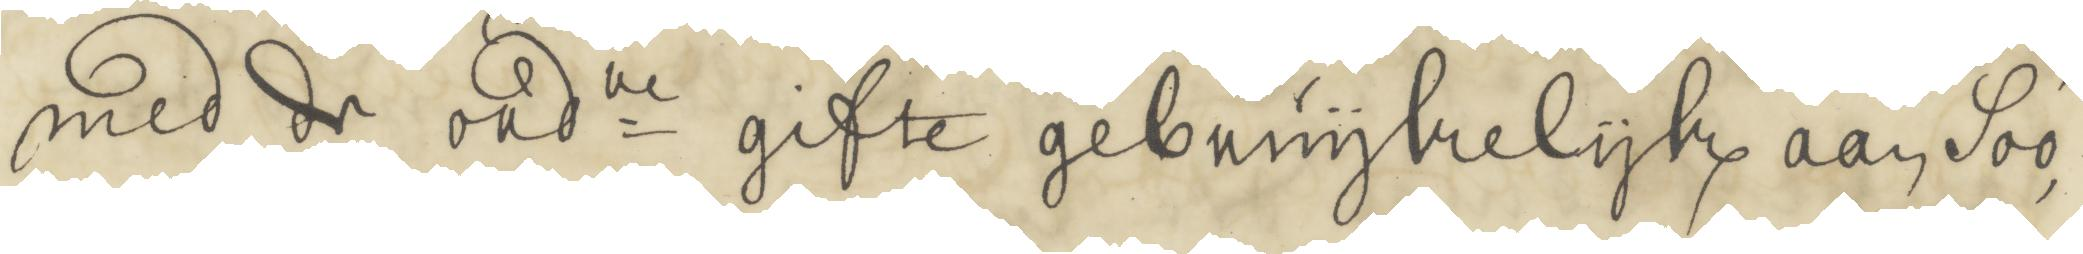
med de ord=re gifte gebruijkelijk aan soo,
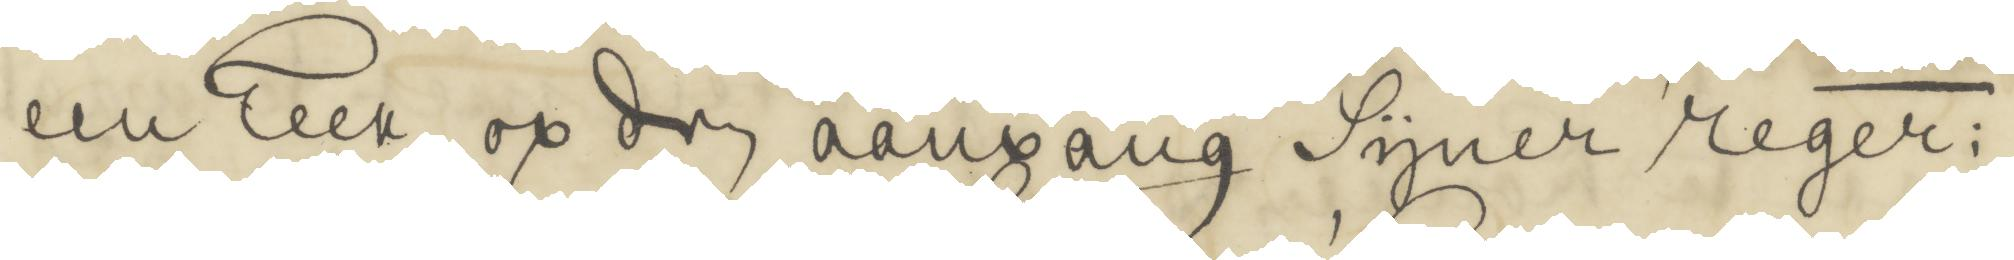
een Heer, op den aanvang sijner reger:
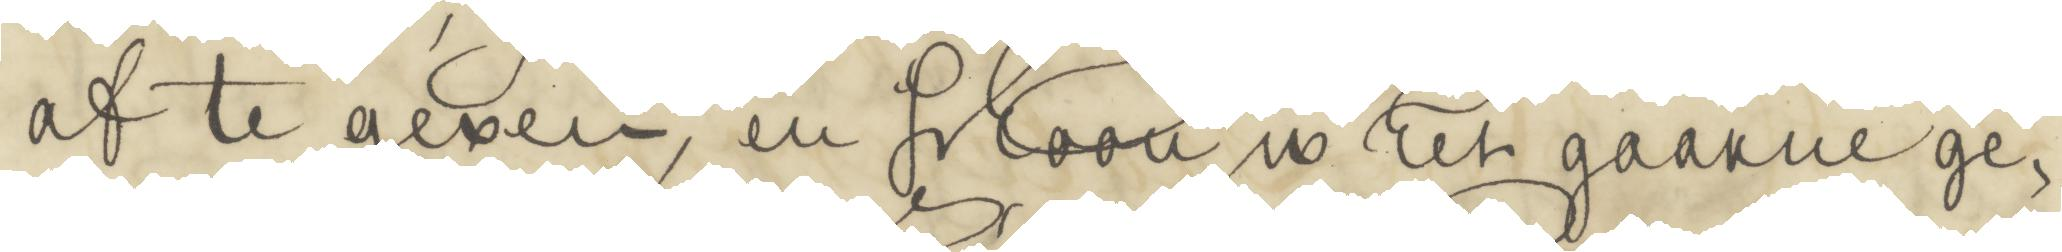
af te geven, en schoon w' het gaarne ge„
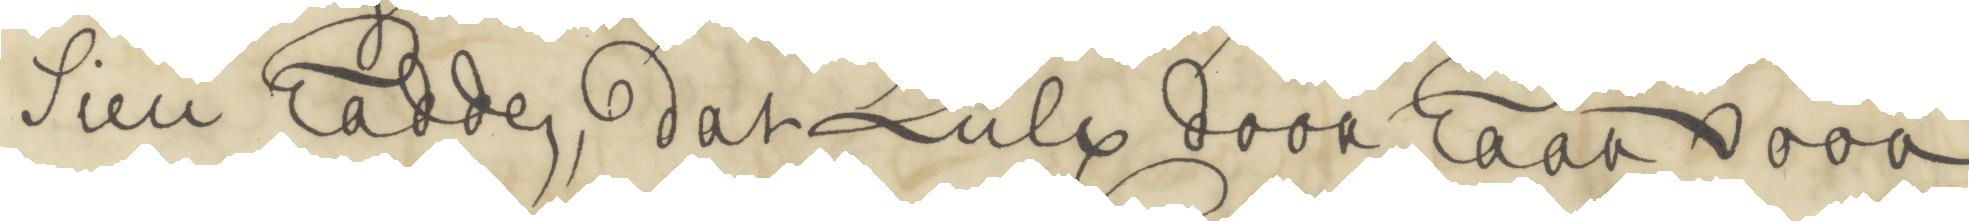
sien hadden, dat zulx door haar voor
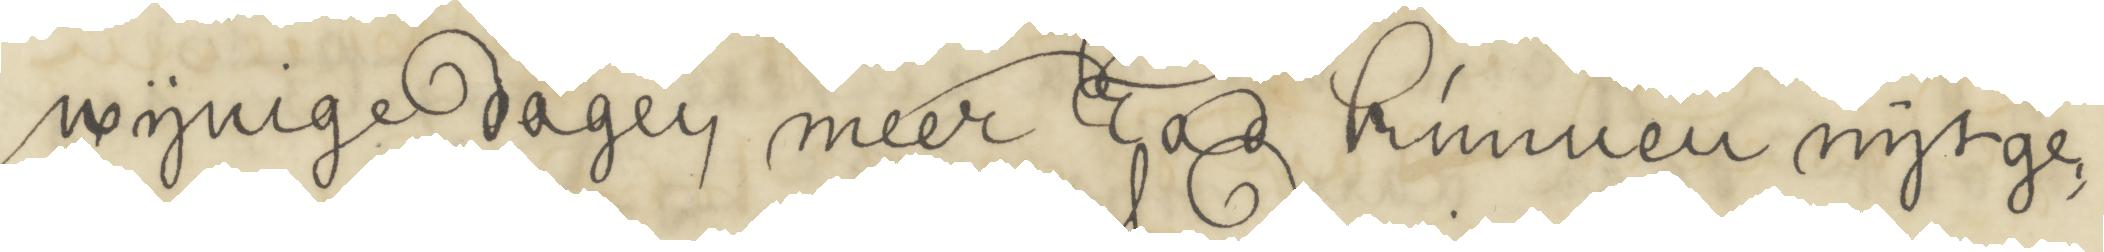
wijnige dagen meer had kunnen uijt ge„
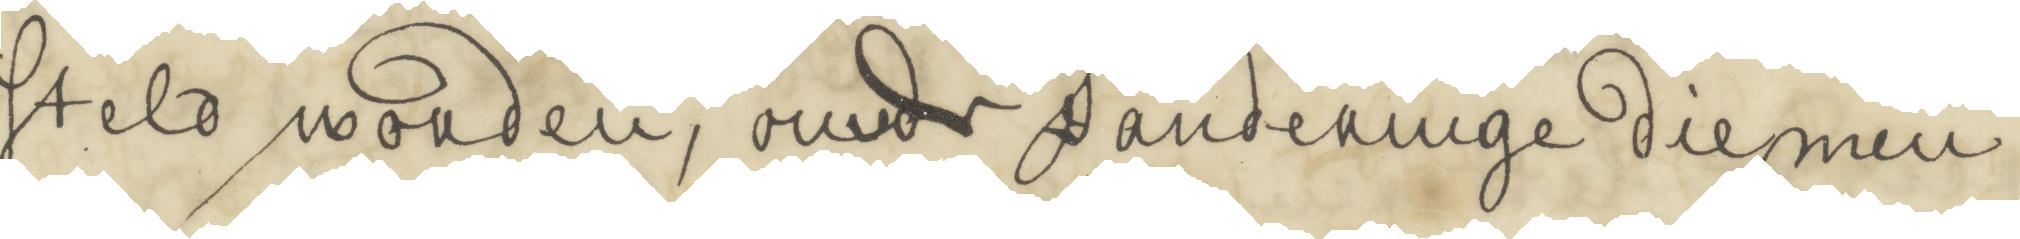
steld worden, onder veranderinge die men
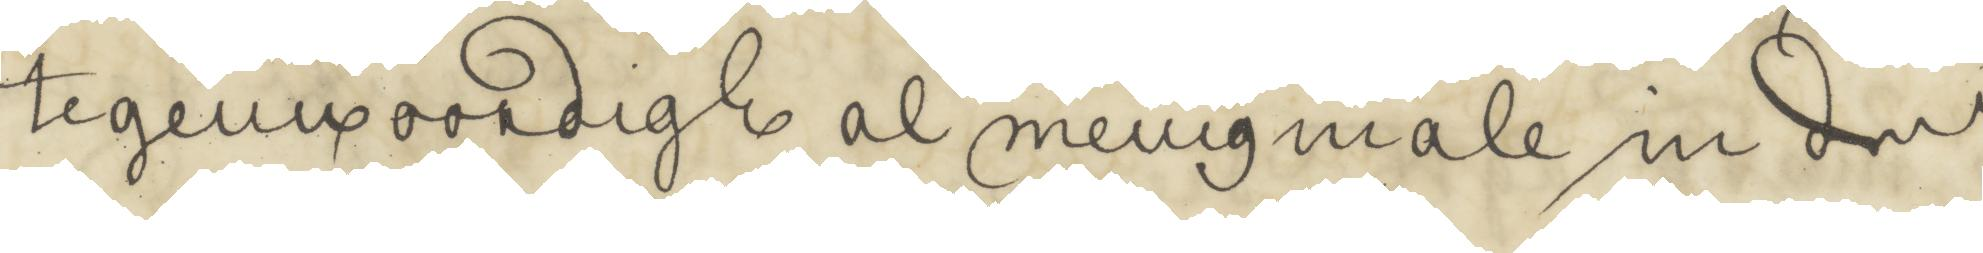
tegenwoordigh al menig male in de
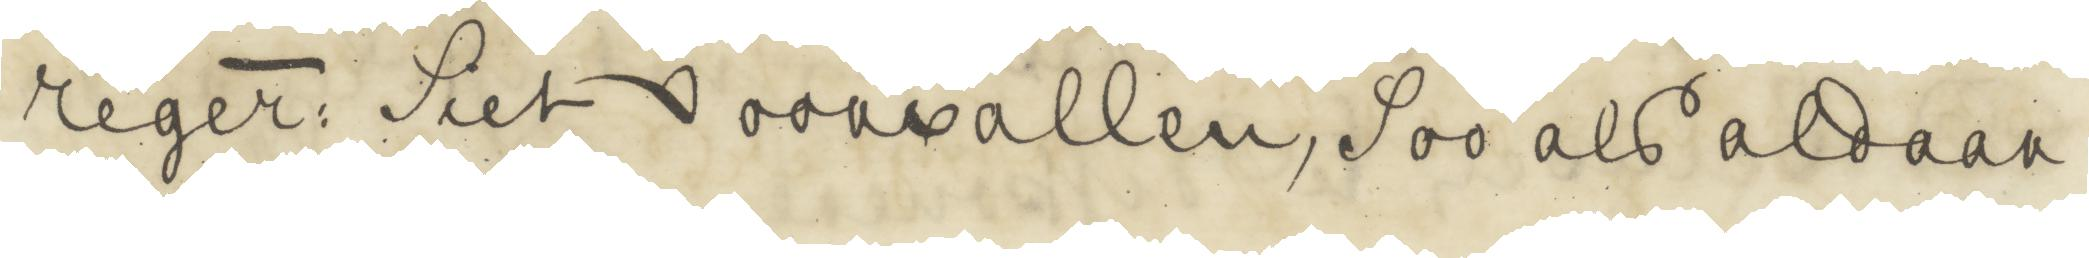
reger: siet voorvallen, soo als aldaar
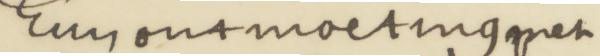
hun ontmoeting met
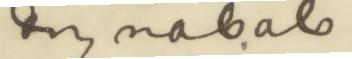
den nabab
